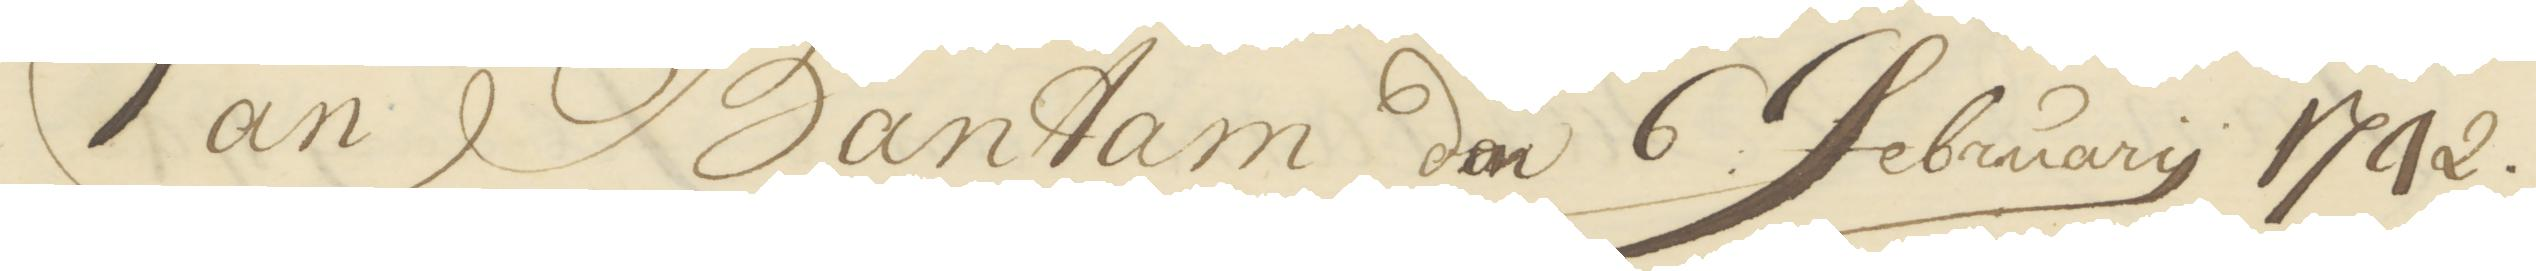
Van Bantam den 6: Februarij 1742.
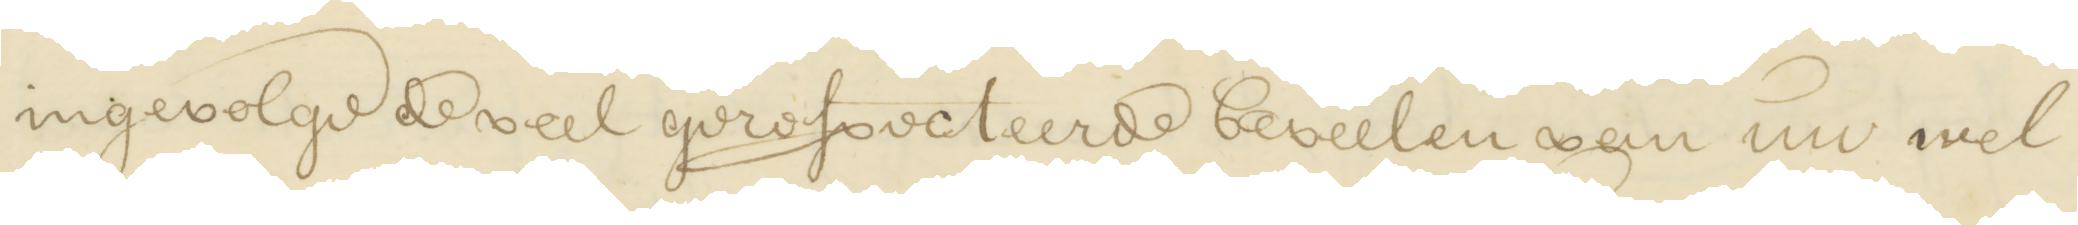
ingevolge de veel gerespecteerde beveelen van uw wel
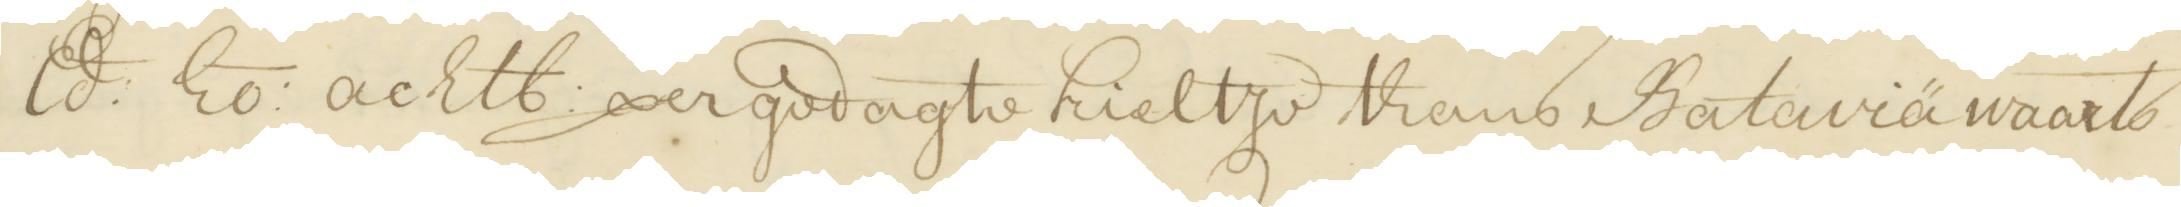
Ed: ho: achtb: per gedagte kieltje thans Bataviä waarts
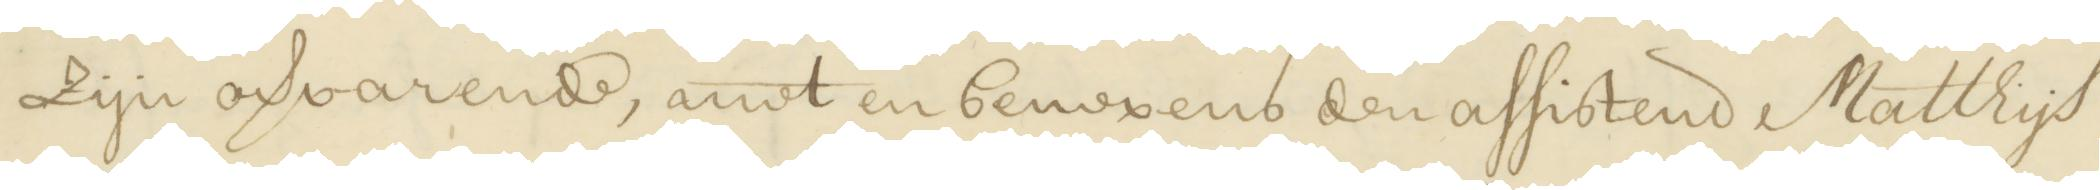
zijn overvarende, met en benevens den assistend Matthijs
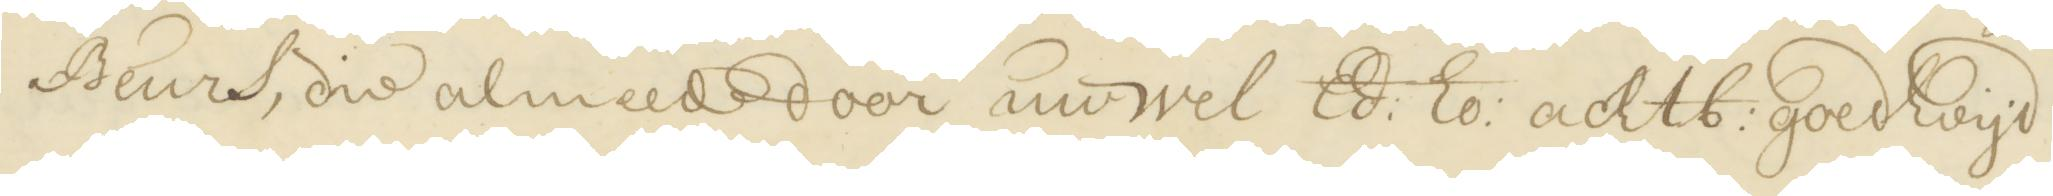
Beurs, die almeede door uw wel Ed: ho: achtb: goedheijd
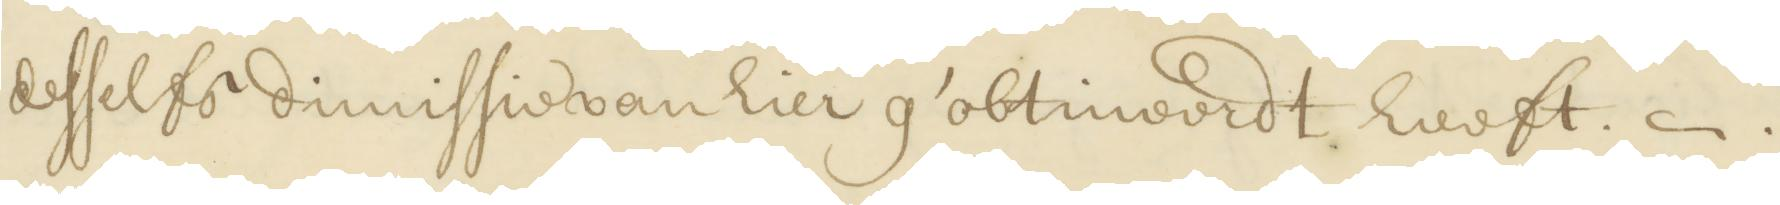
desselfs dimissie van hier g’obtineerdt heeft. — .
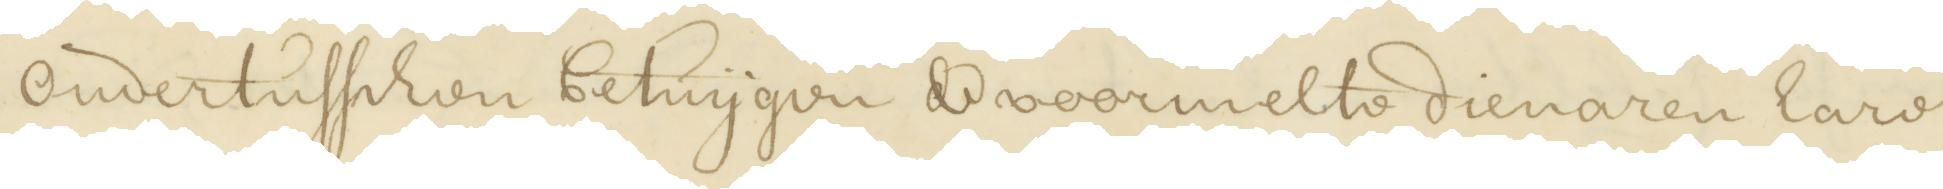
Ondertusschen betuijgen de voormelte dienaren hare
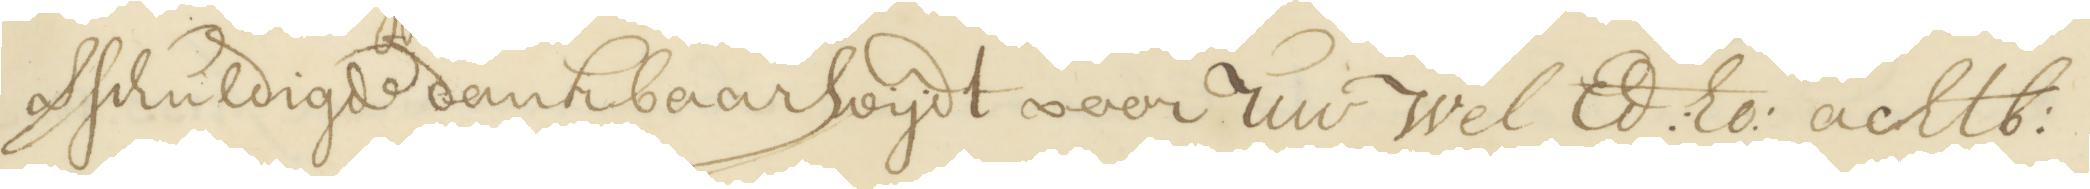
verschuldigde dankbaarheijdt voor uw wel Ed: ho: achtb:
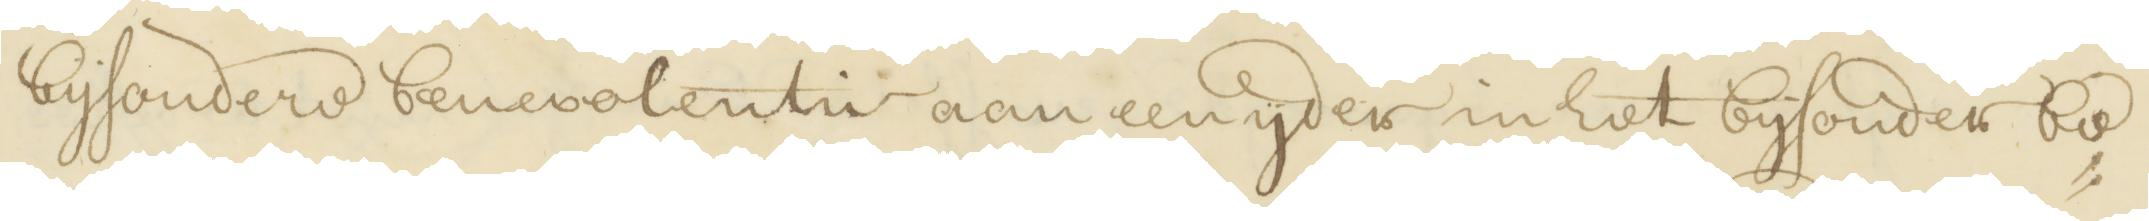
bijsondere benevolentie aan een ijder in het bijsonder be„
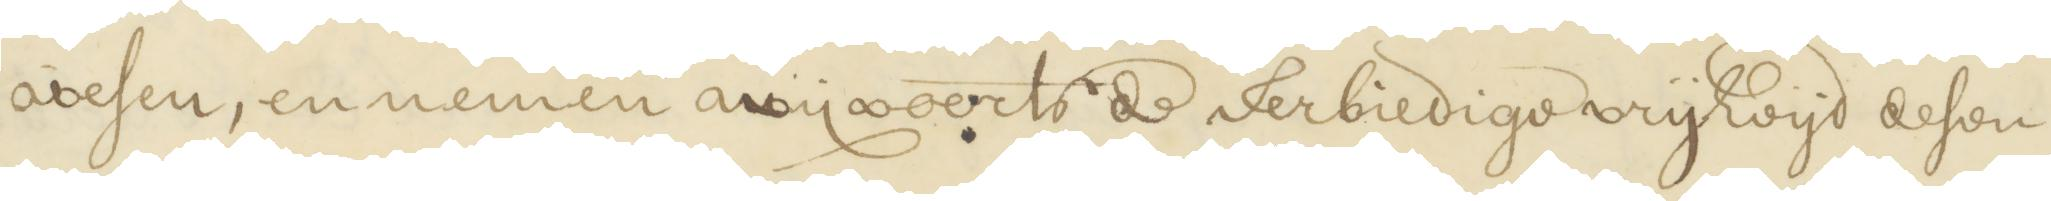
wesen, en nemen wij voorts de Eerbiedige vrijheijd desen
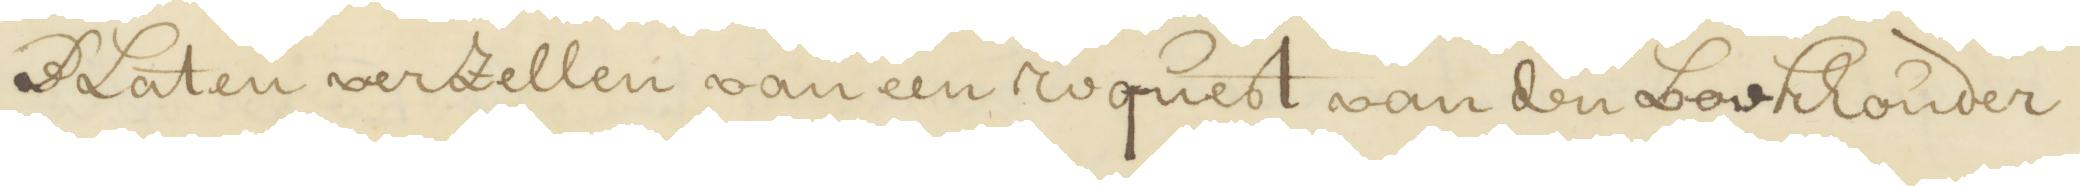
te laten verzellen van een request van den boekhouder
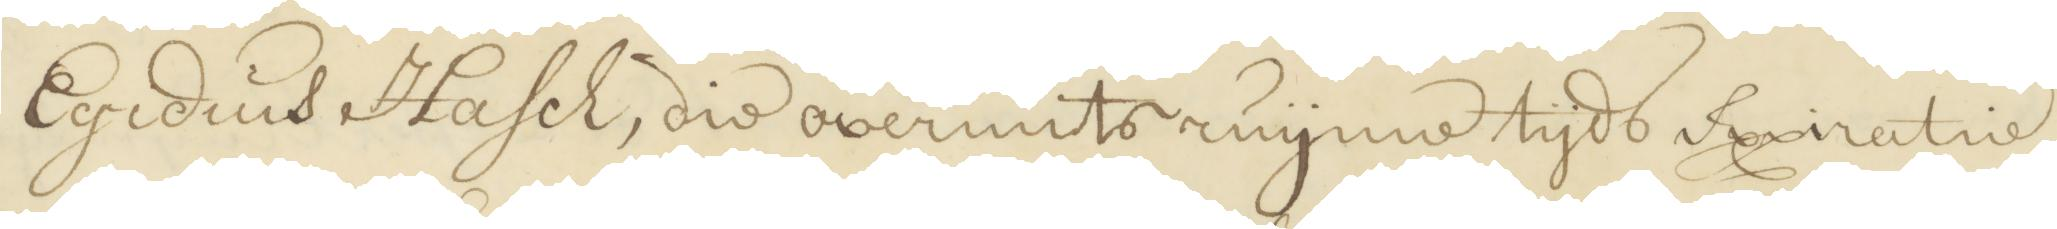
Egidius Hasch, die overmits ruijme tijds Expiratie
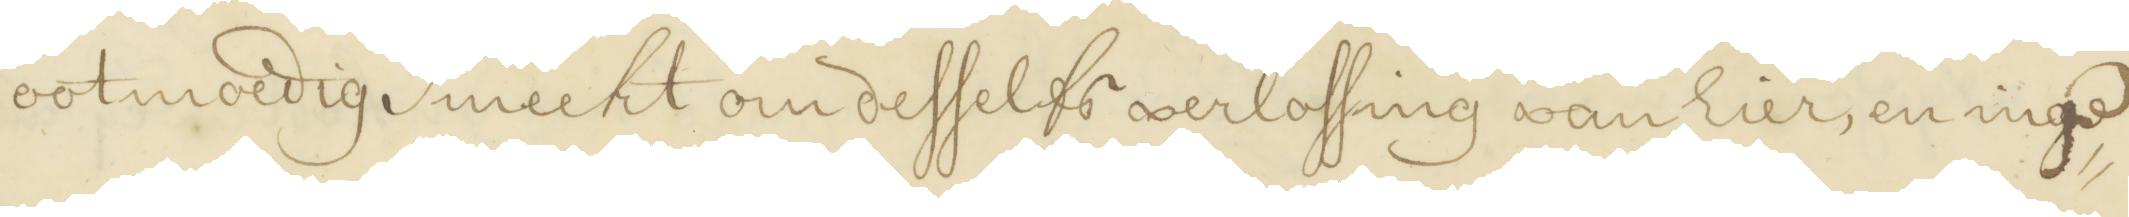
ootmoedig smeekt om desselfs verlossing van hier, en inge„
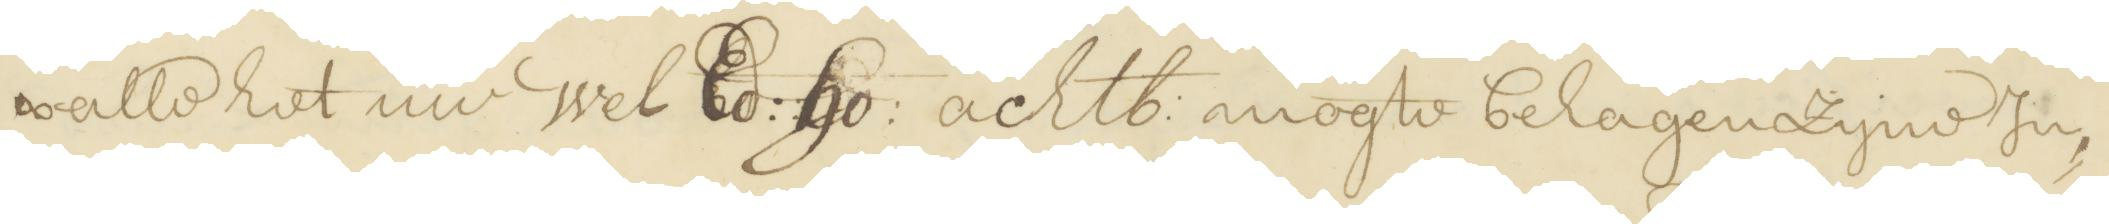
valle het uw wel Ed: Ho: achtb: mogte behagen zijne Jn„
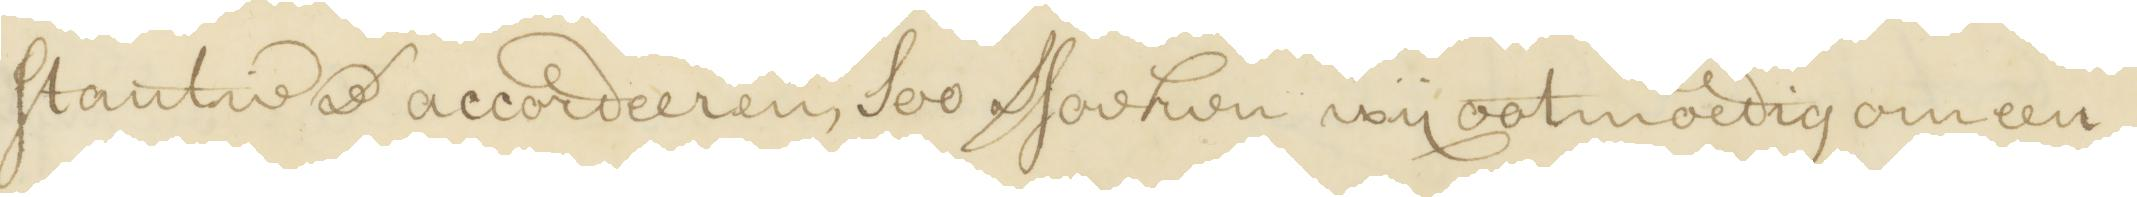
stantie te accordeeren, soo versoeken wij ootmoedig om een
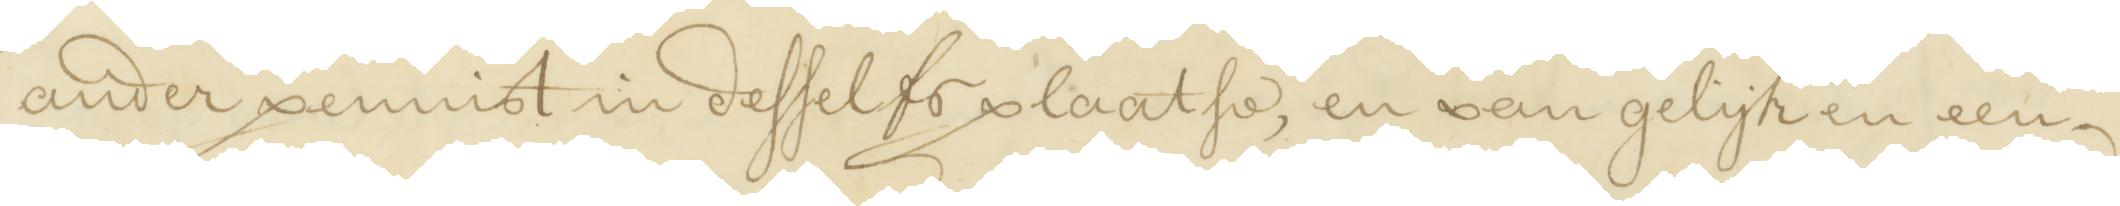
ander pennist in desselfs plaatse, en van gelijk en een
